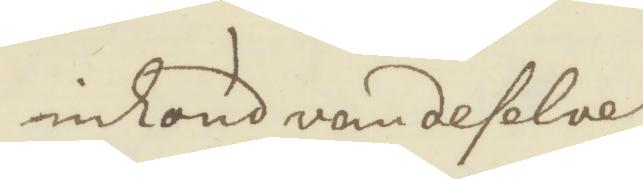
inhoud van deselve
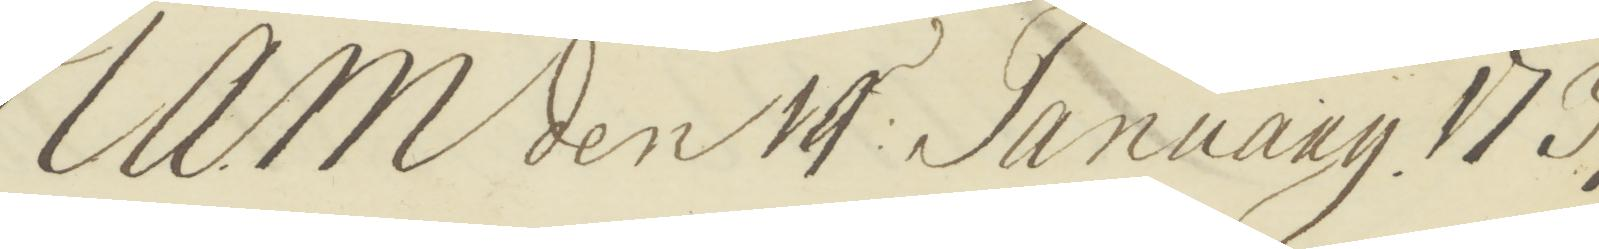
Van Siam den 14:' Januarij 1737
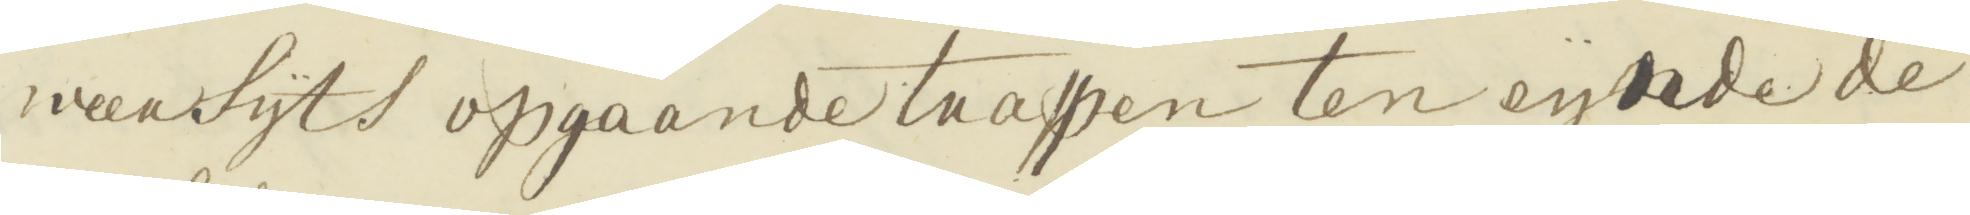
weersijts opgaande trappen ten eijnde de
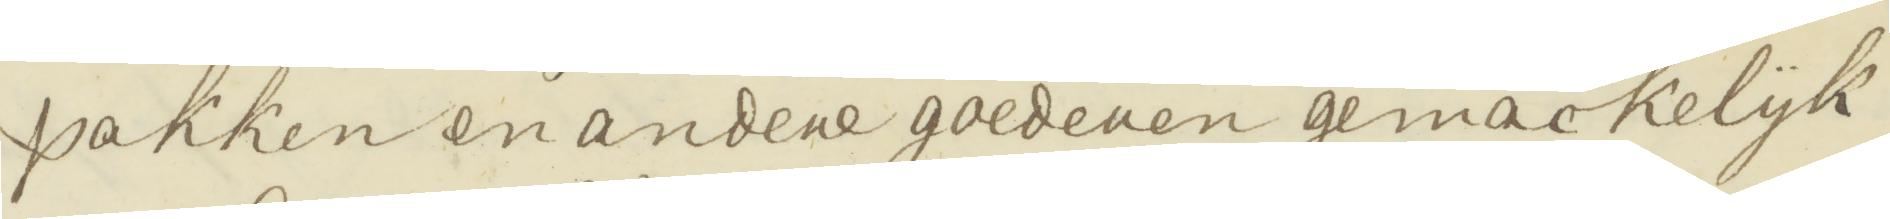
pakken en andere goederen gemackelijk
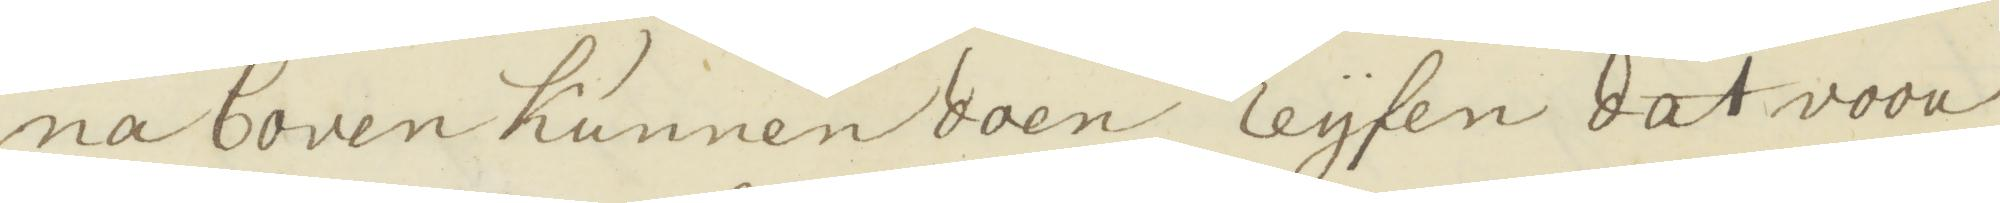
na boven kunnen doen heijsen dat voor
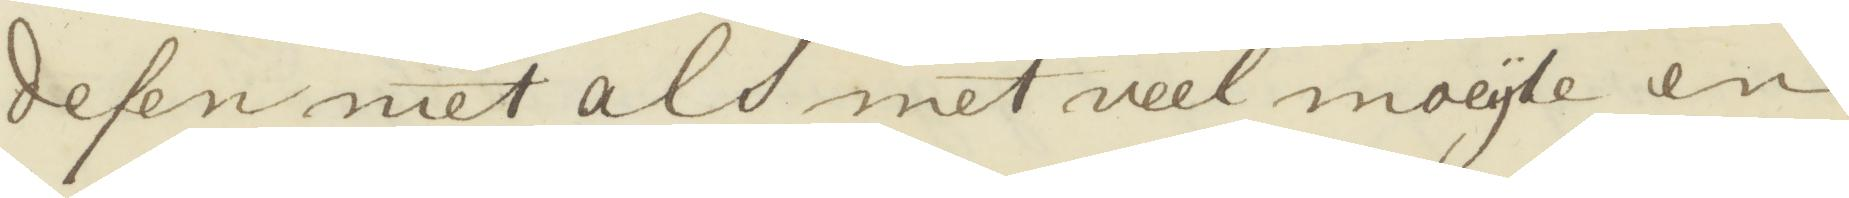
desen niet als met veel moeijte en
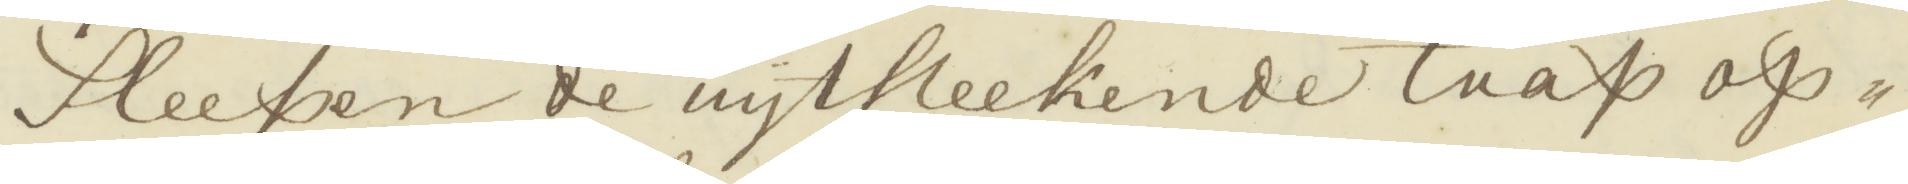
sleepen de uijtsteekende trap op„
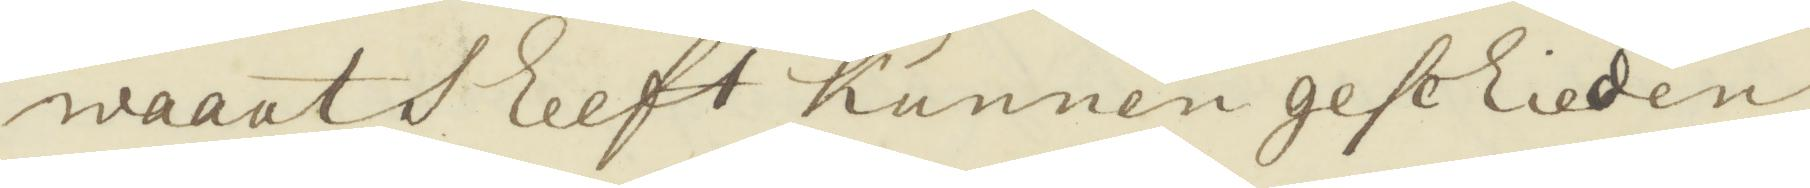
waarts heeft kunnen geschieden
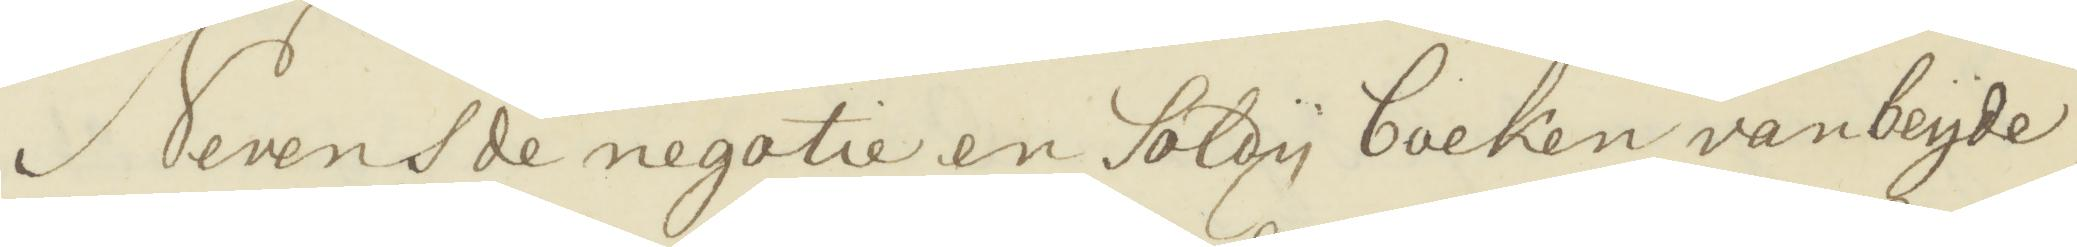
Nevens de negotie en Soldij boeken van beijde
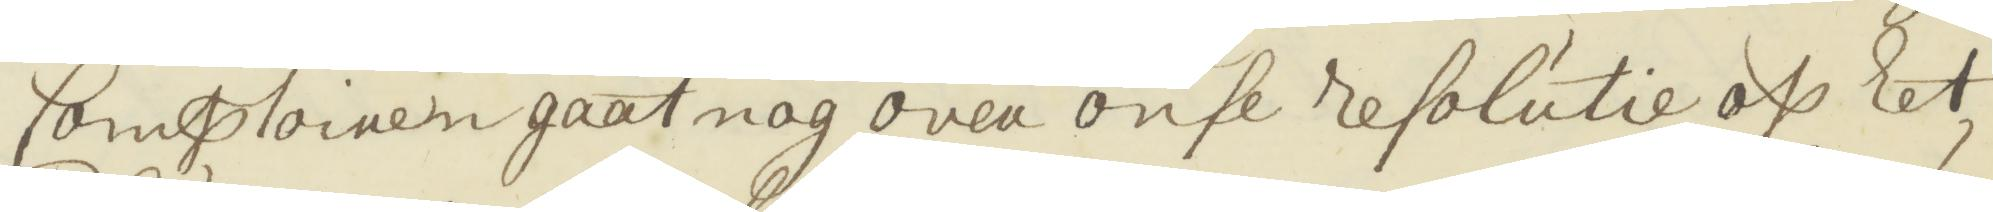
Comptoiren gaat nog over onse resolutie op het
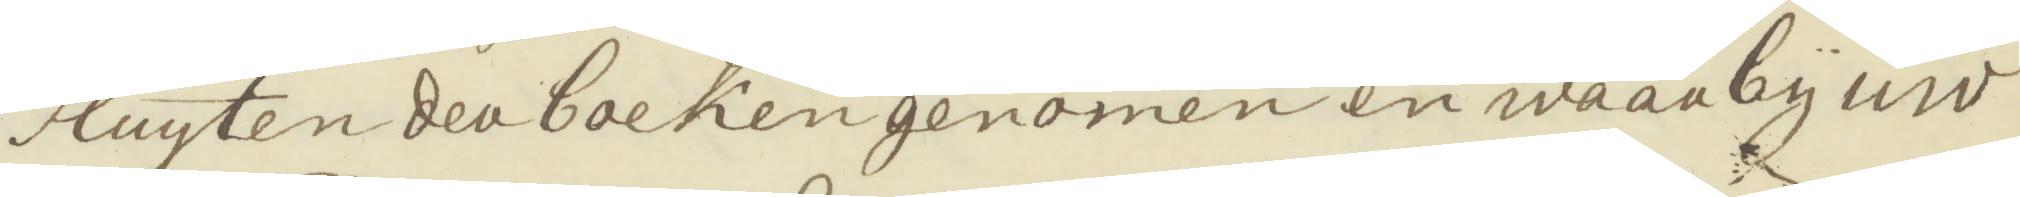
sluijten der boeken genomen en waarbij uw
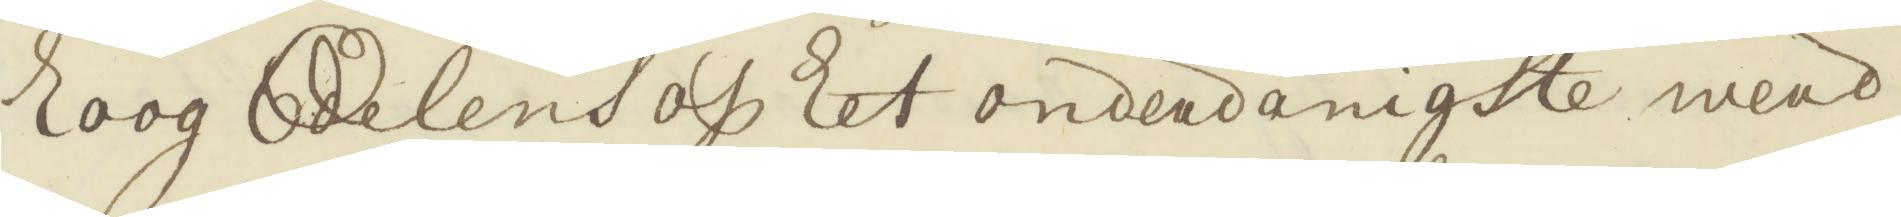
hoog Edelens op het onderdanigste werd
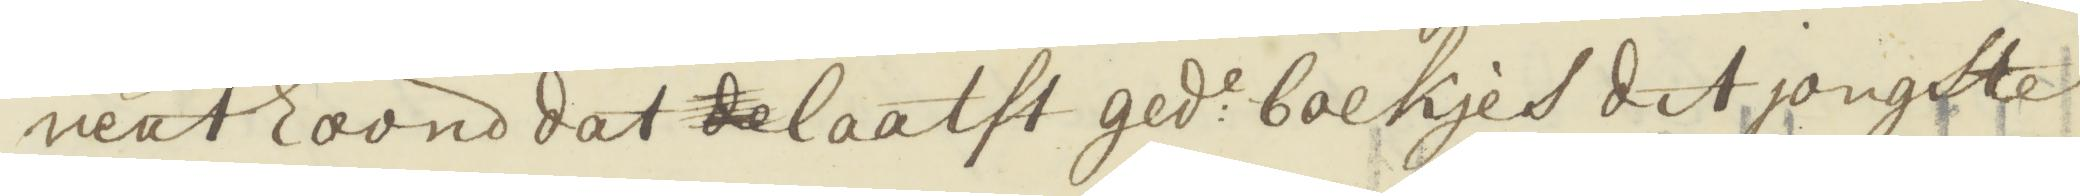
verthoond dat de laatst ged:e boekjes dit jongste
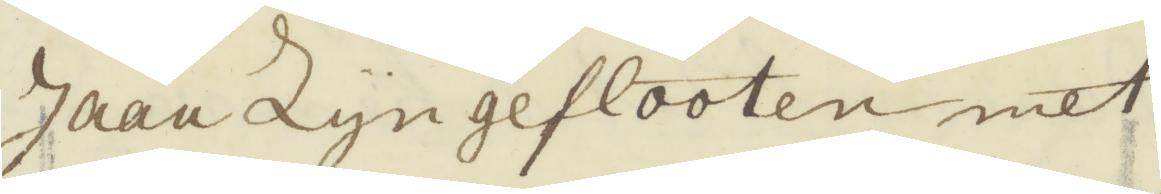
Jaar zijn geslooten met
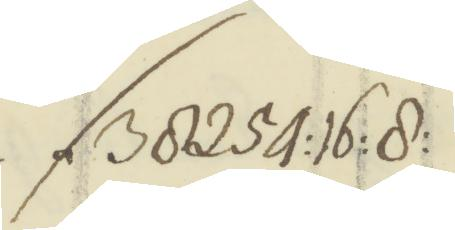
ƒ38254:16:8:
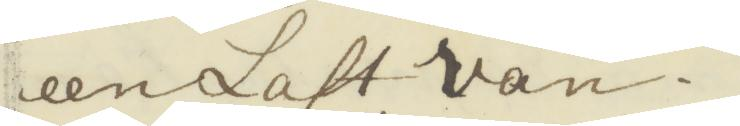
een Last van -
